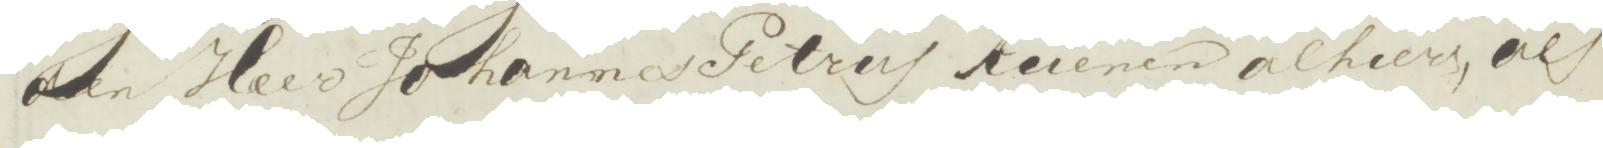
den Heer Johannes Petrus Kuenen alhier, als
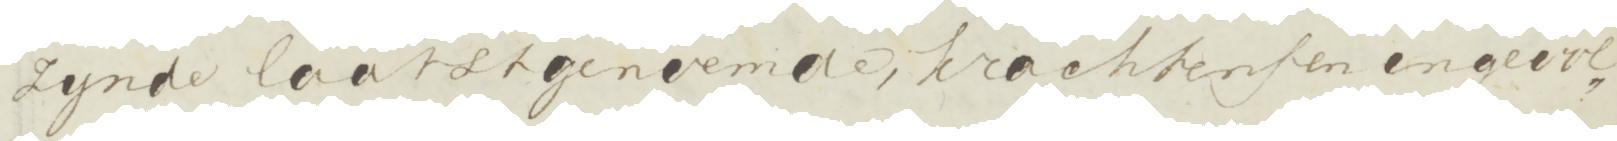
zynde laatstgenoemde, krachtens en ingevol„
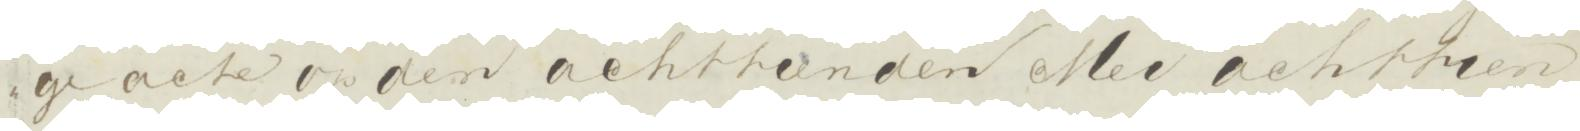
„ge acte op den achttienden Mei achttien
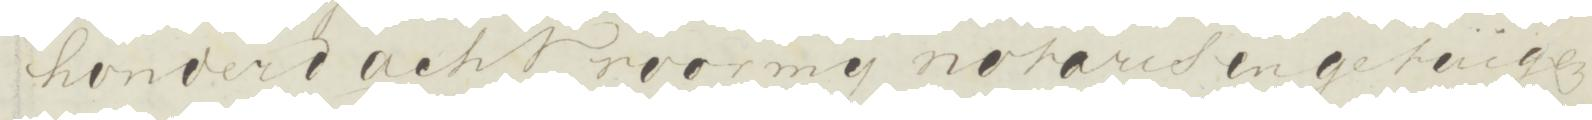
honderd acht voor my notaris en getuigen
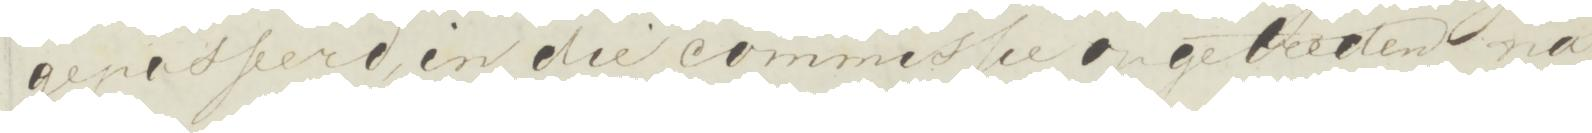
gepasseerd, in die commissie op getreden na
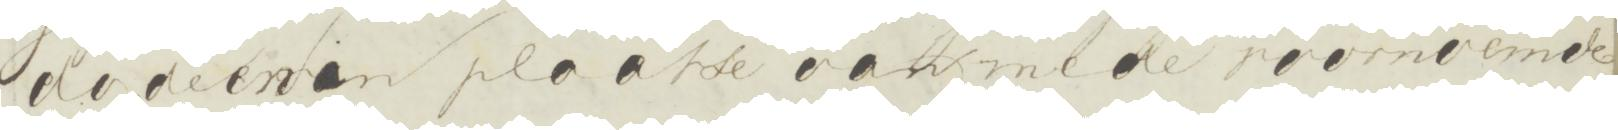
dode en in plaatse van mede voornoemde
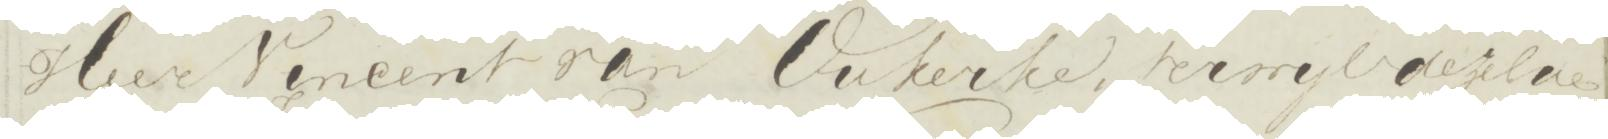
Heer Vincent van Oukerke, terwyl dezelve
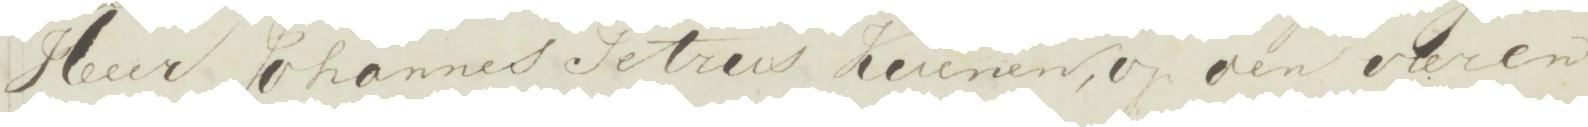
Heeer Johannes Petrus Kuenen, op den vieren
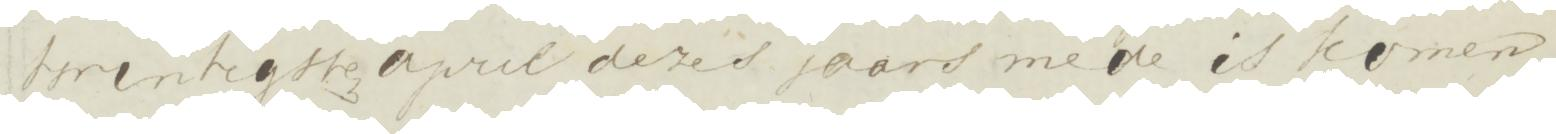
twintigsten april dezes jaars mede is komen
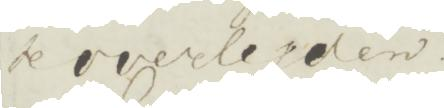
te overlyden.
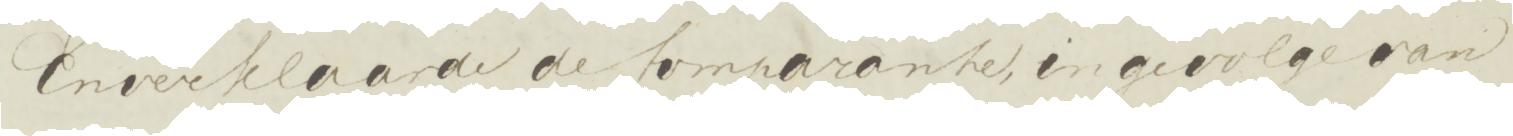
En verklaarde de comparante, in gevolge van
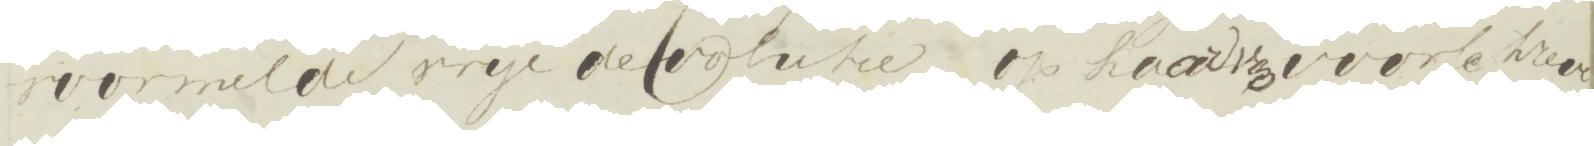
voormelde vrye devolutie op haar van voorschreve
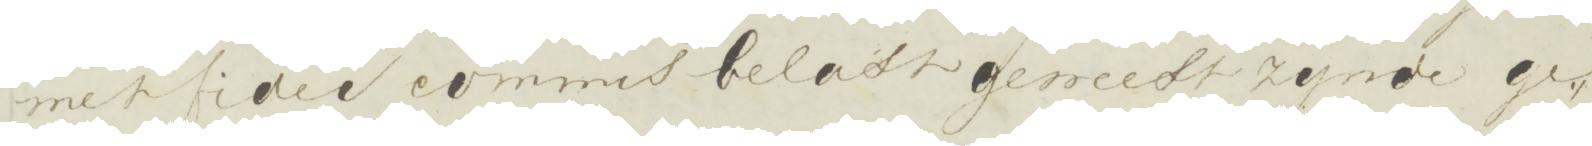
met fidei commis belast geweest zynde ge„
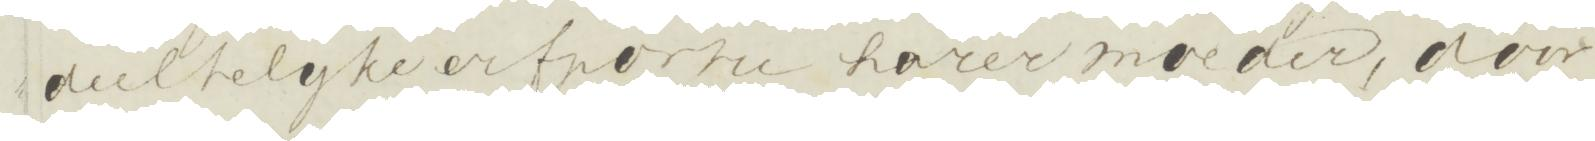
„deeltelyke erfportie harer moeder, door
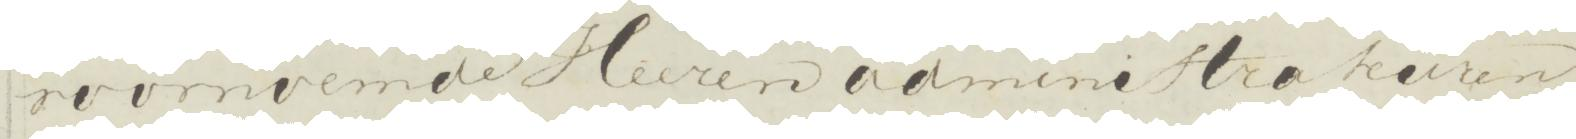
voornoemde Heeren administrateuren
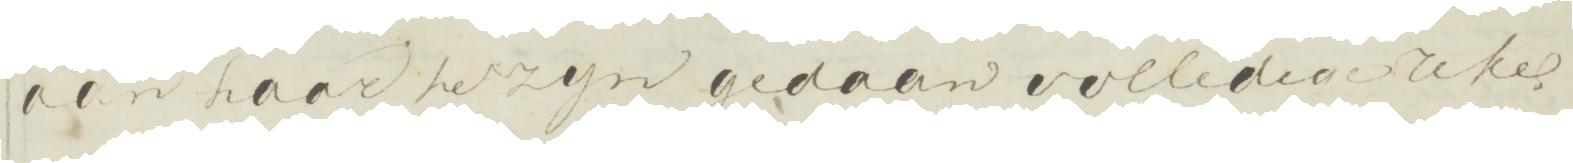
aan haar te zyn gedaan volledige reke„
